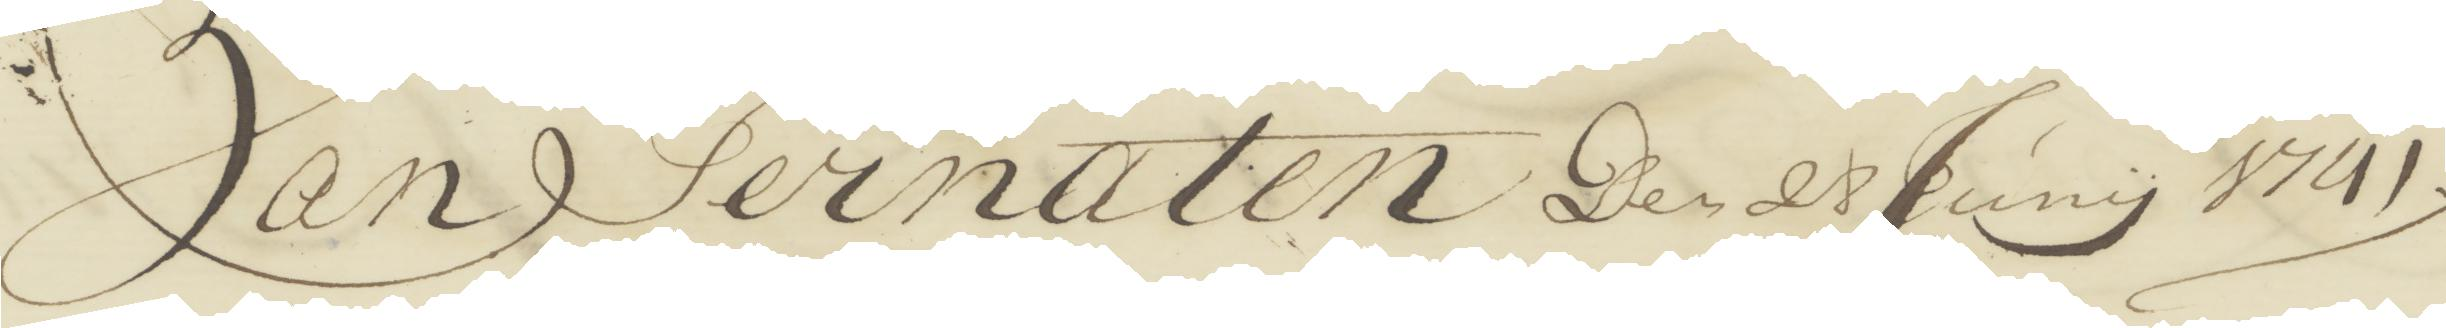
Van Ternaten Den 28 Junij 1741
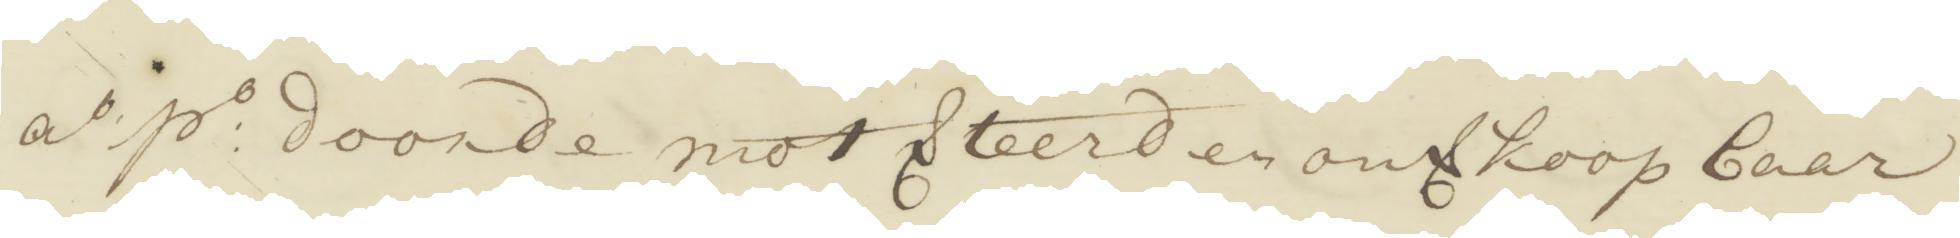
a.o p:o door de mot verteerd en onverkoopbaar
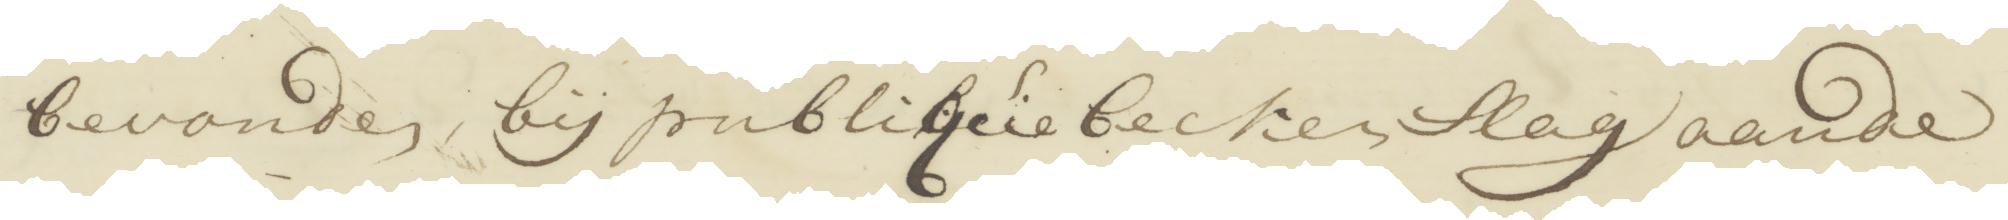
bevonden, bij publique becken slag aande
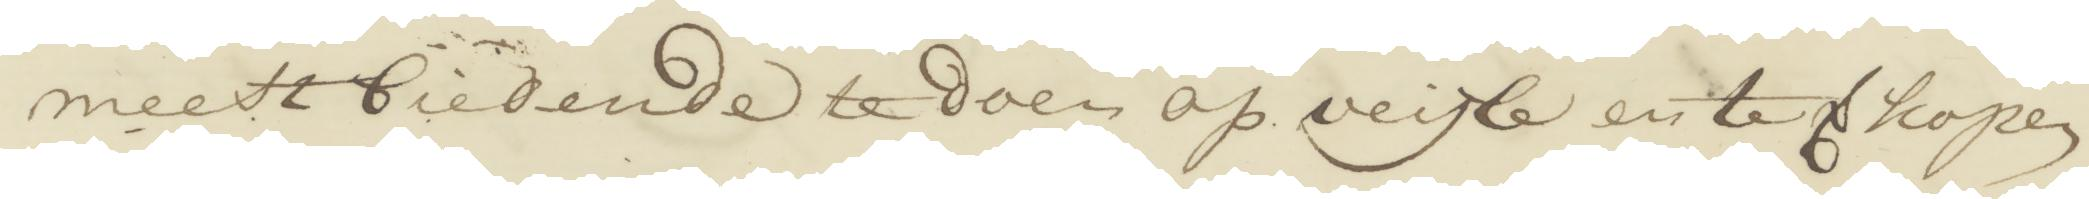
meest biedende te doen op veijle en te verkopen
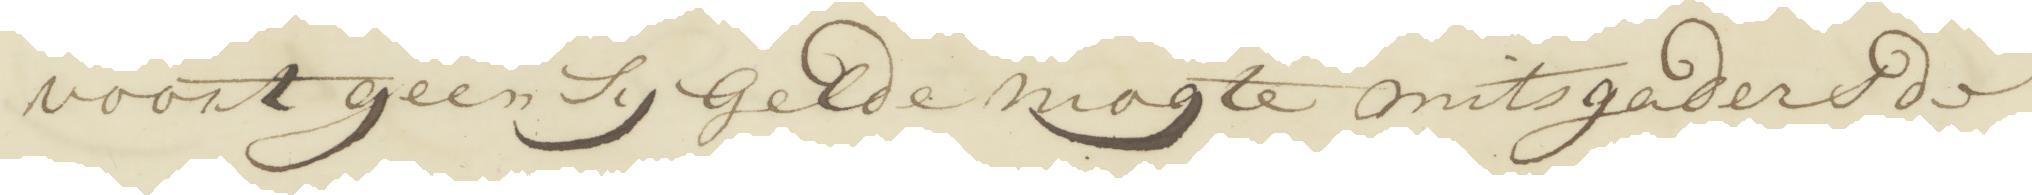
voort geen sy gelde mogte mitsgaders de
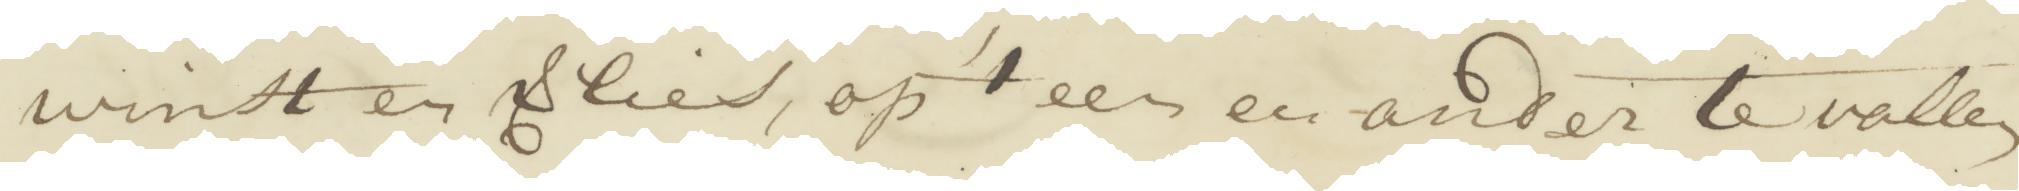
winst en verlies, op ’t een en ander te vallen
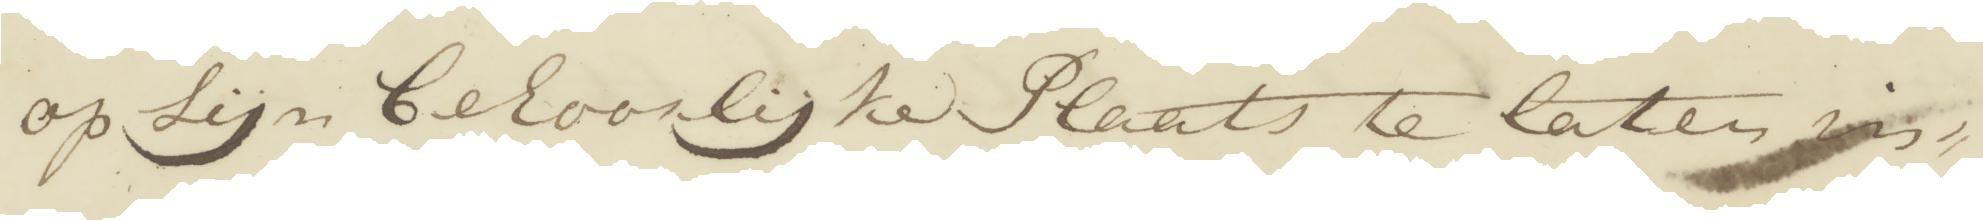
op sijn behoorlijke Plaats te laten in„
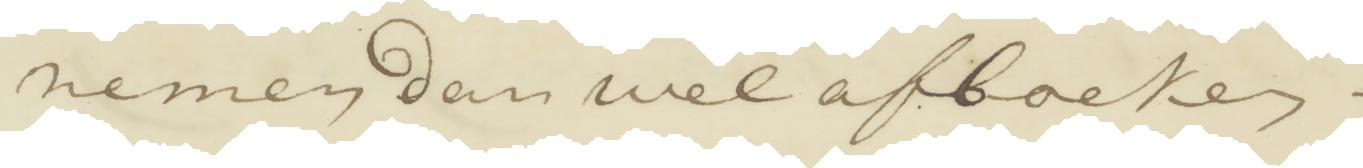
nemen dan wel afboeken
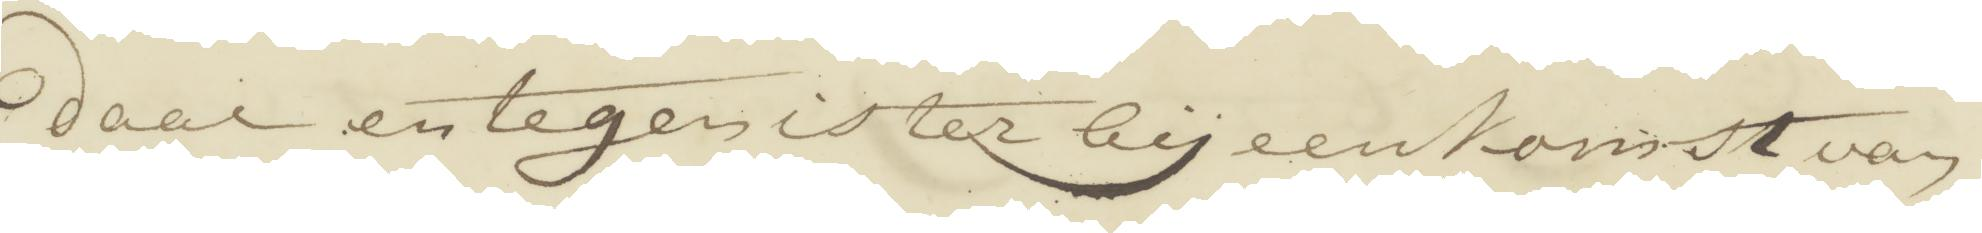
daar en tegen is ter bij eenkomst van
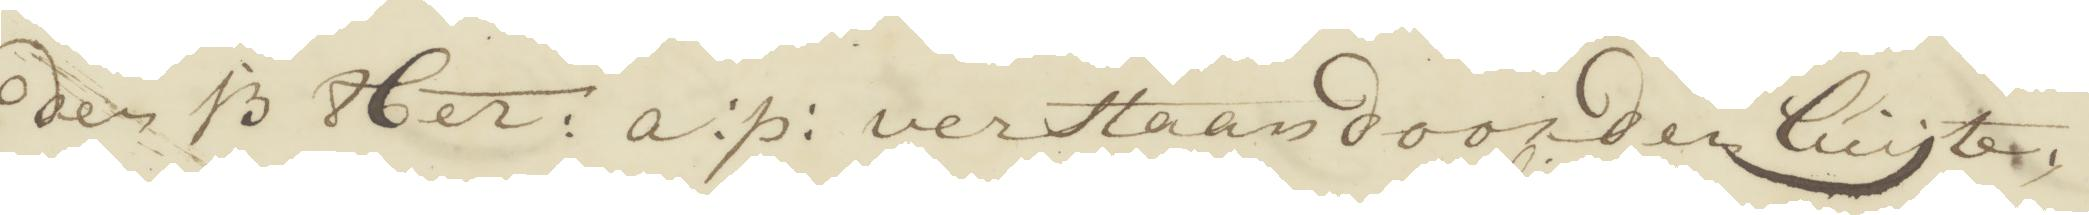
den 13 8ber: a: p: verstaan door den luijte„
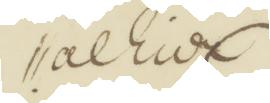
„alhier
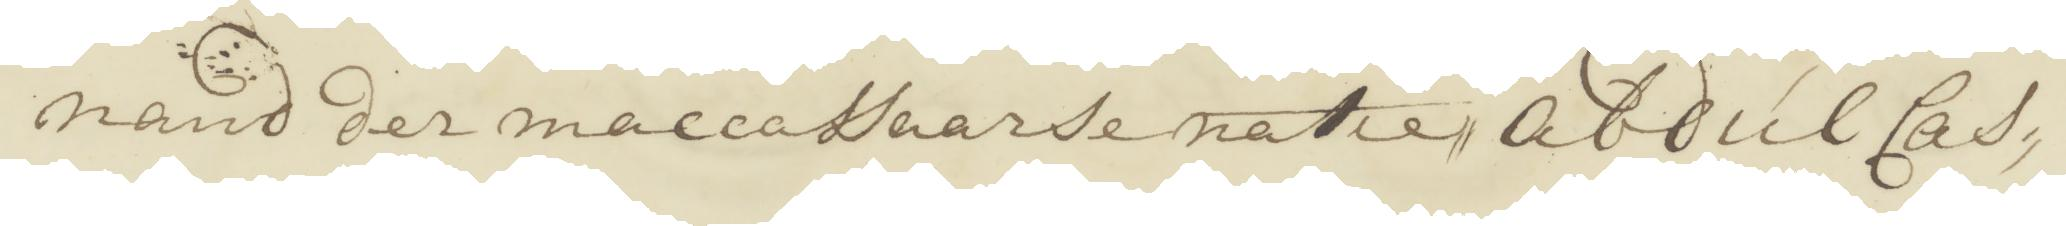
nand der maccassaarse natie„ abdul Cas„
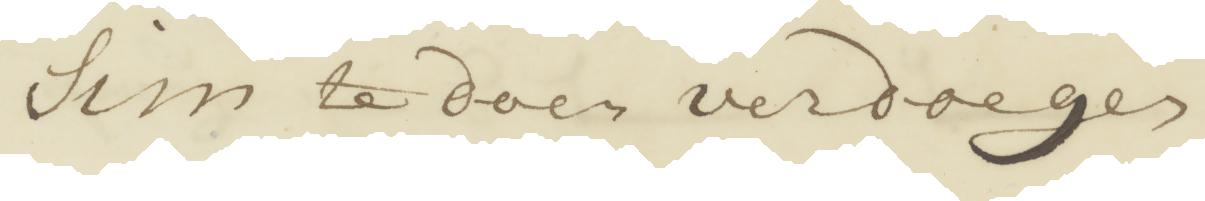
sim te doen verdaegen
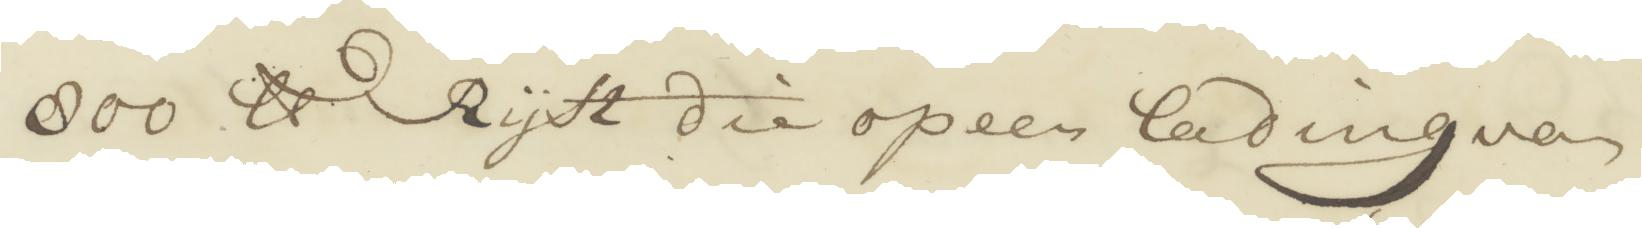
800 lb Rijst die op een lading van
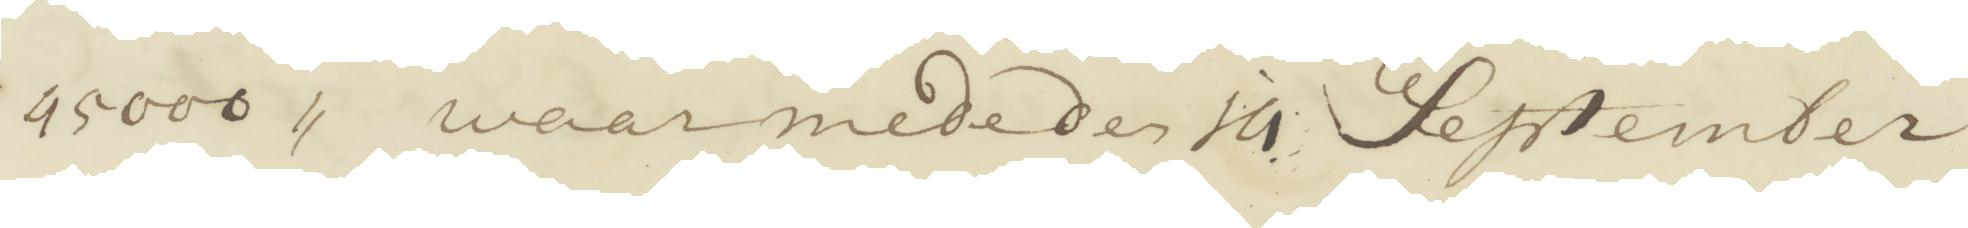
45000 „ waar mede den 14. September
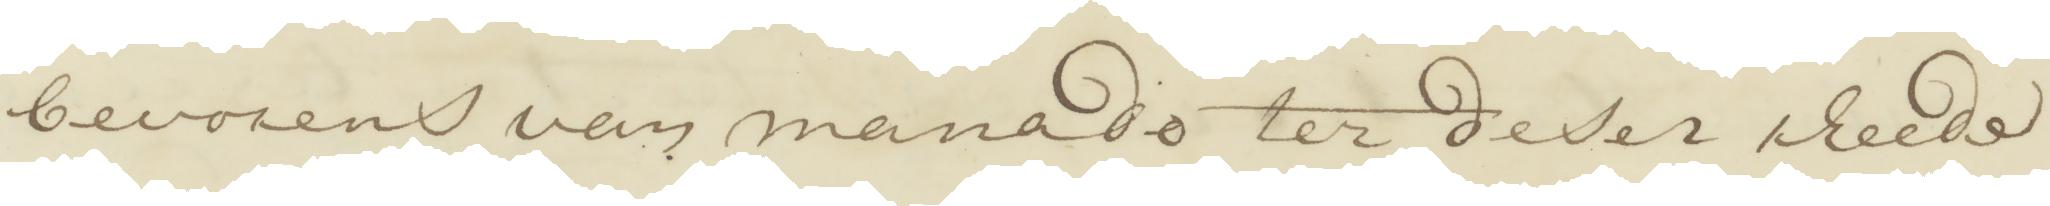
bevorens van manado ter deser rheede
